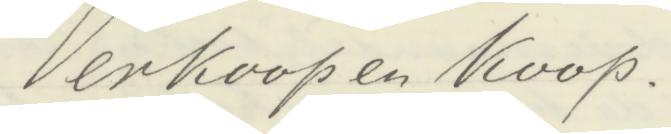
Verkoop en Koop.
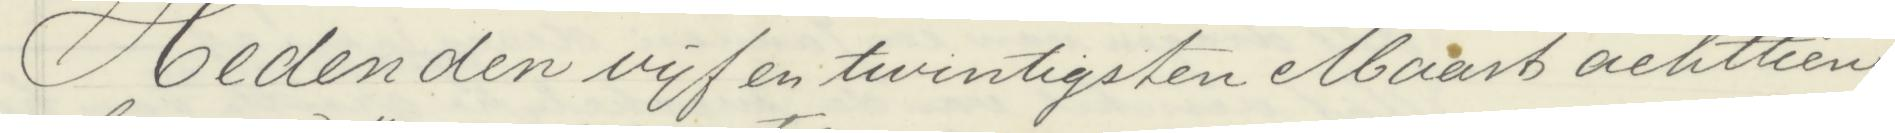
Heden den vijf en twintigsten Maart achttien
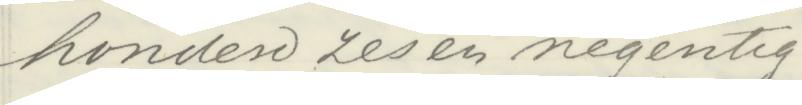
honderd zes en negentig
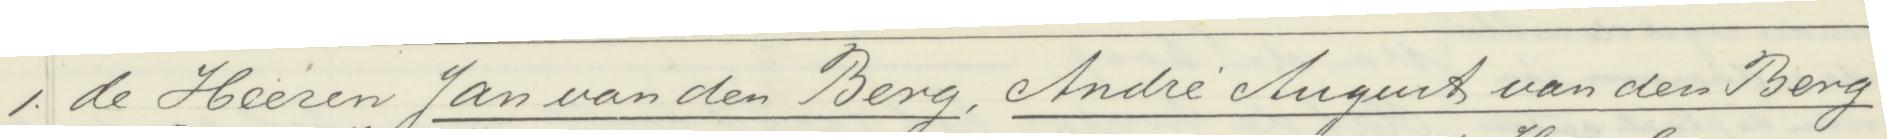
1. de Heeren Jan van den Berg, André August van den Berg
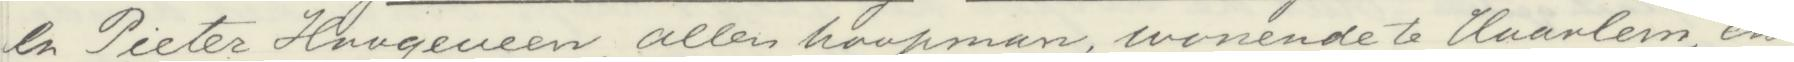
en Pieter Hoogeveen, allen koopman, wonende te Haarlem, en
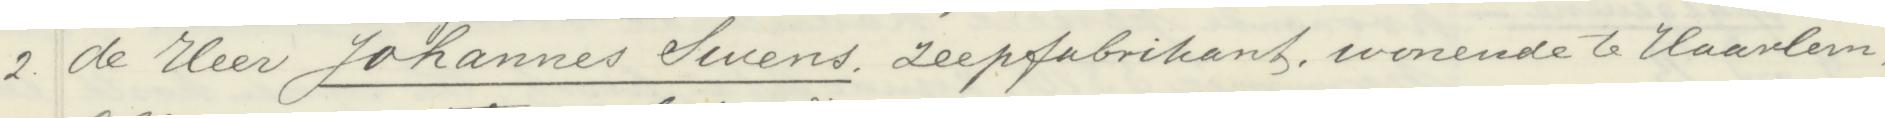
2. de Heer Johannes Swens, zeepfabrikant, wonende te Haarlem
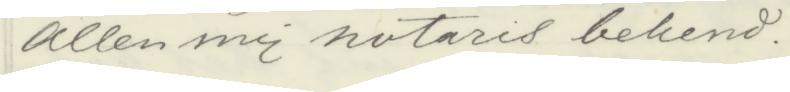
allen mij notaris bekend.
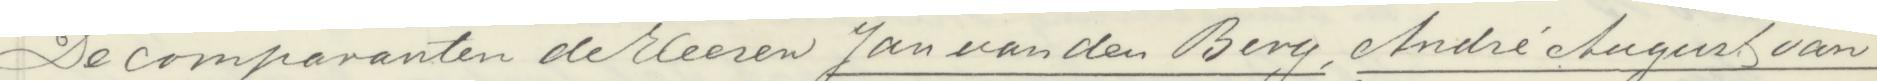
De comparanten de Heeren Jan van den Berg, André August van
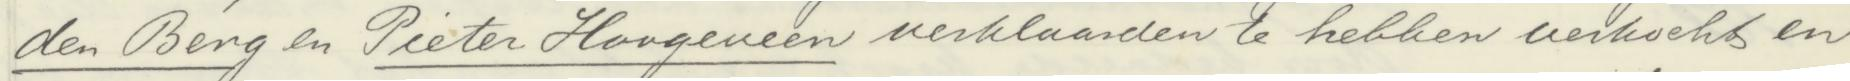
den Berg en Pieter Hoogeveen verklaarden te hebben verkocht en
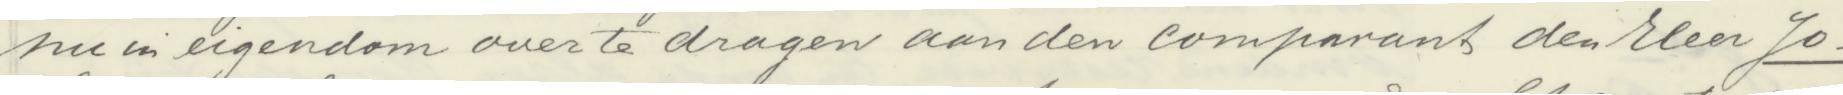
nu in eigendom over te dragen aan den comparant den Heer Jo
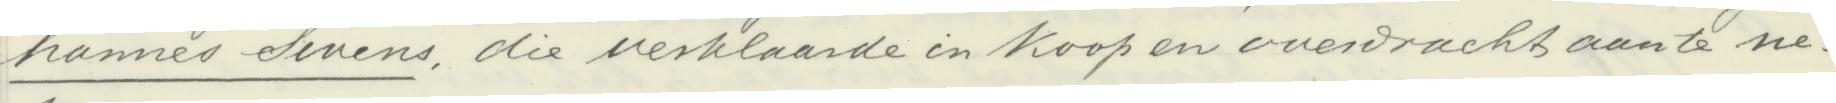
hannes Sevens, die verklaarde in koop en overdracht aan te ne-
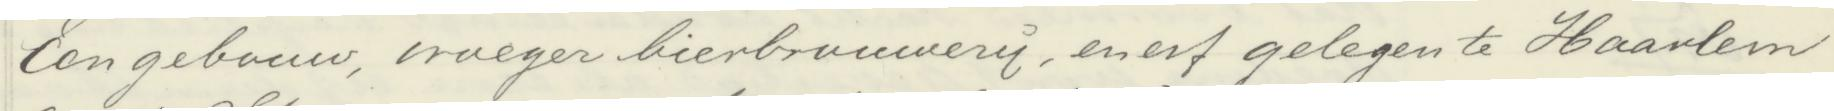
Een gebouw, vroeger bierbrouwerij, en erf gelegen te Haarlem
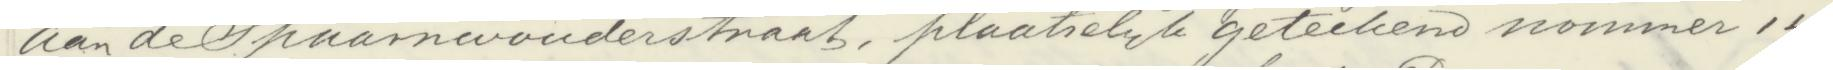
aan de Spaarnwouderstraat, plaatselijk geteekend nommer 14
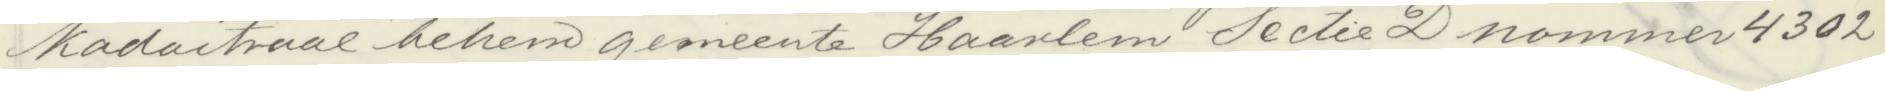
kadastraal bekend gemeente Haarlem Sectie D nommer 4302
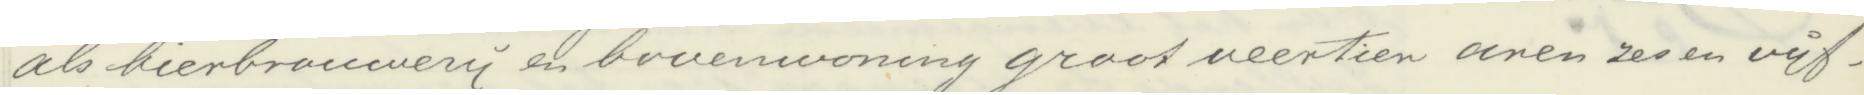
als bierbrouwerij en bovenwoning groot veertien aren zes en vijf-
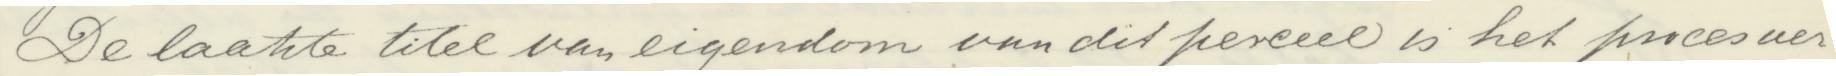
De laatste titel van eigendom van dit perceel is het procesver
